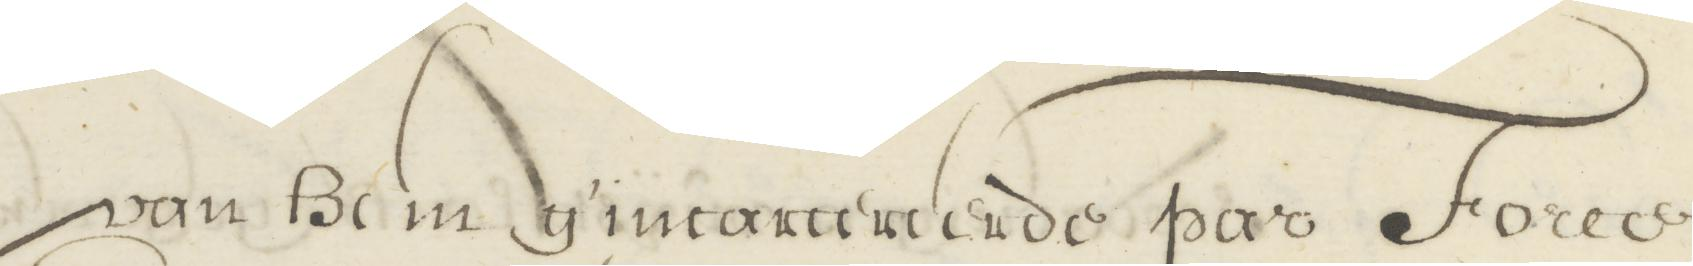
van hem g'incarcereerde par Force
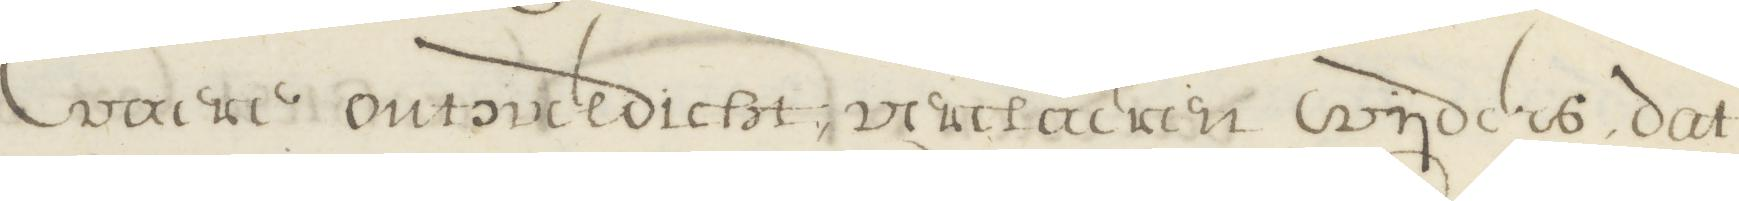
waere ontweldicht; verclaeren wijders, dat
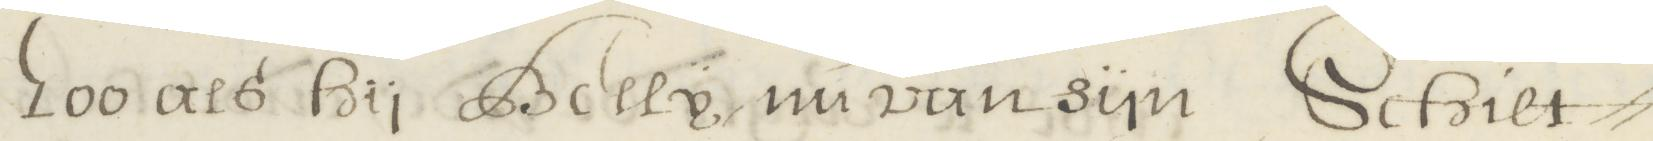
zoo als hij Bellij nu van sijn Schiet„
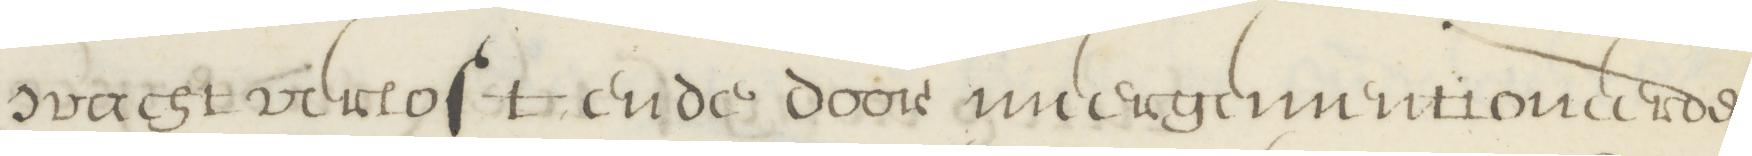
wacht verlost, ende door meergementioneerden
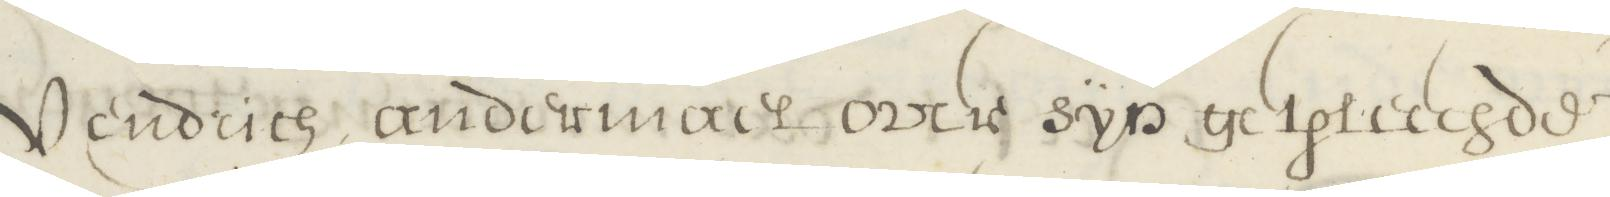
vendrich, andermael over sijn gepleechde
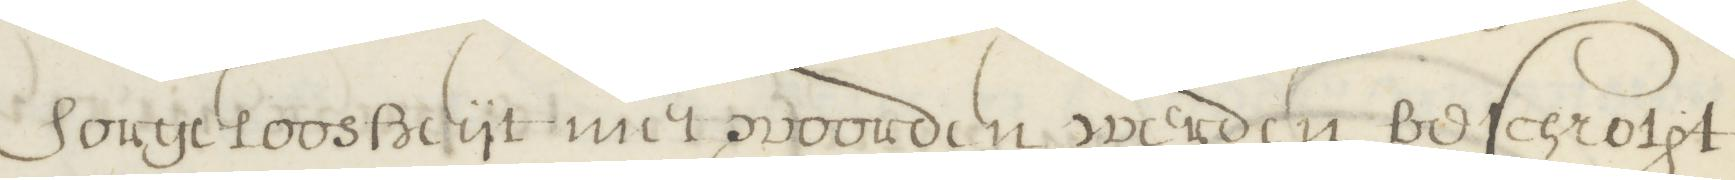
sorgeloosheijt met woorden werden beschropt
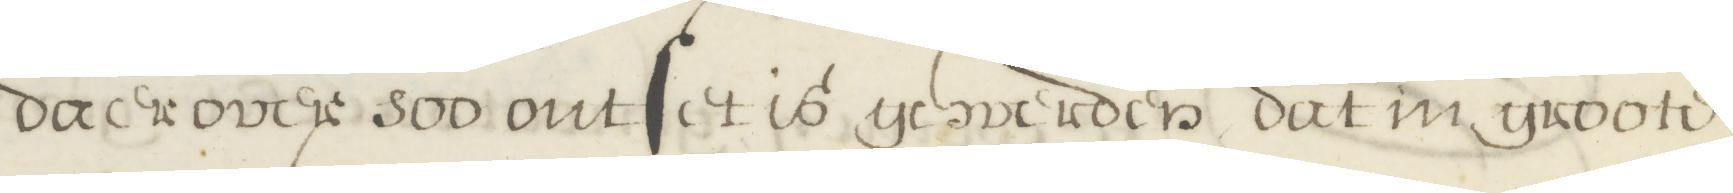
daer over soo ontset is gewerden, dat in groote
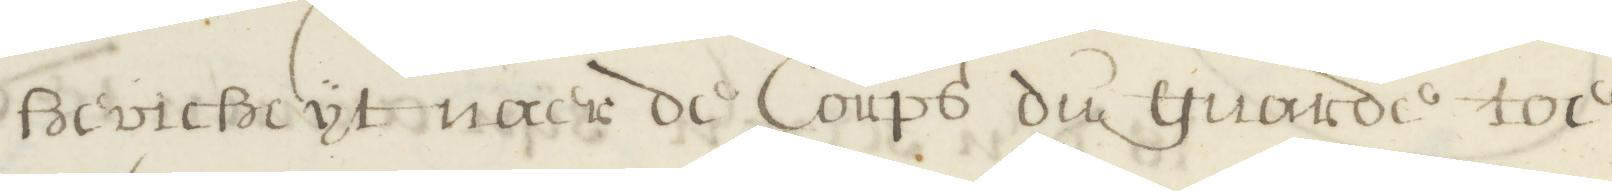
hevicheijt naer de Corps du guarde toe
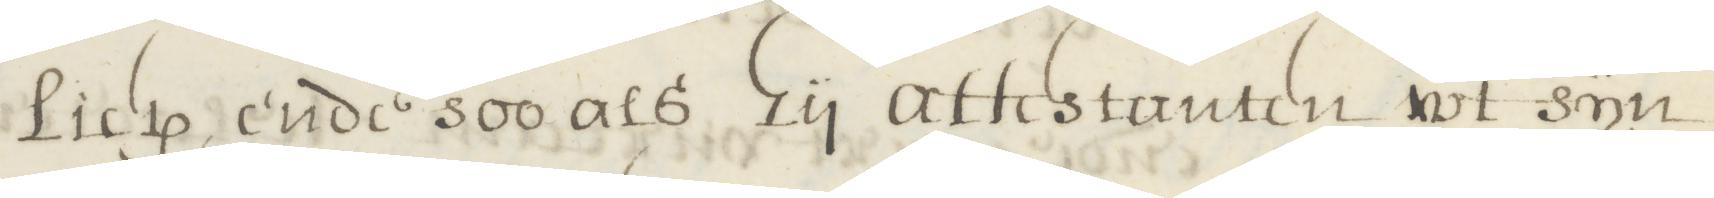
liep, ende soo als zij attestanten tot sijn
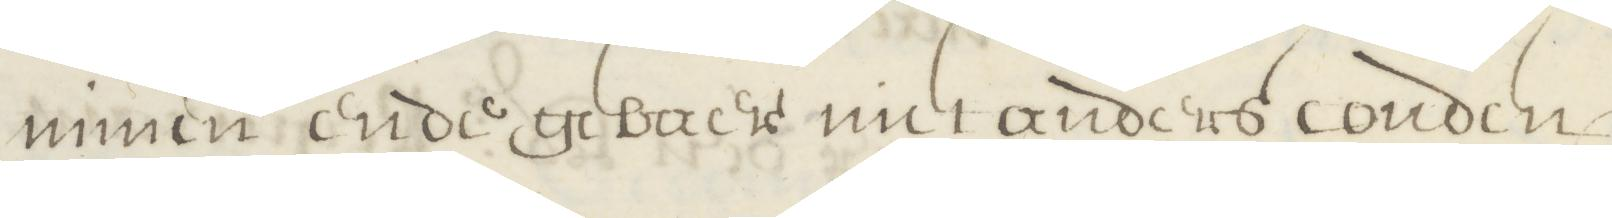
innen ende gebaer niet anders conden
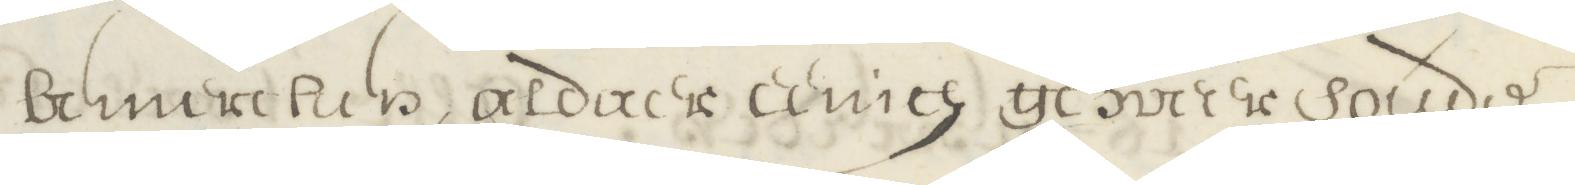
bemercken, aldaer eenich geweer soude
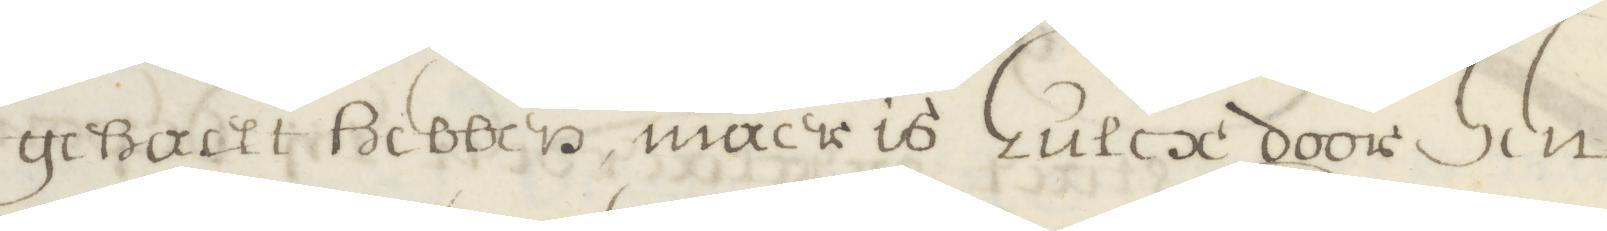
gehaelt hebben, maer is zulcx door hen
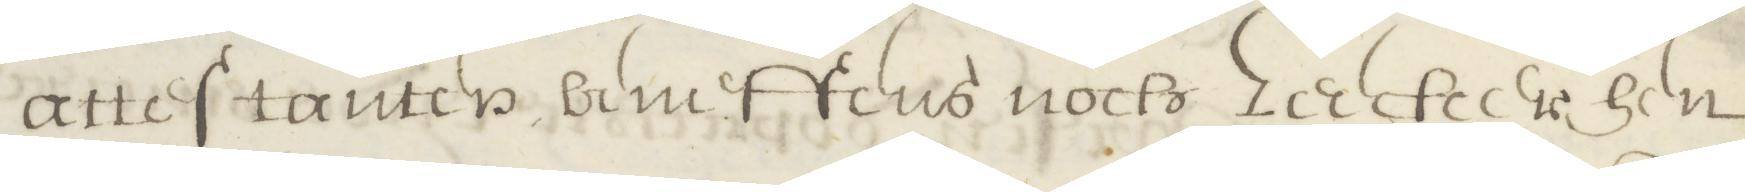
attestanten, beneffens noch zeecker hen
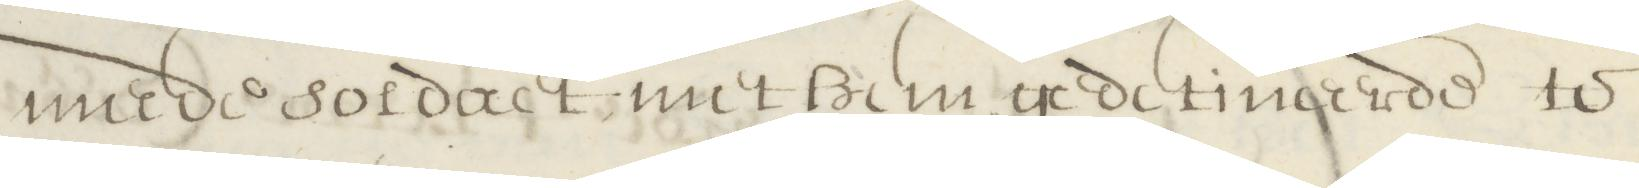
meede soldaet, met hem gedetineerde te
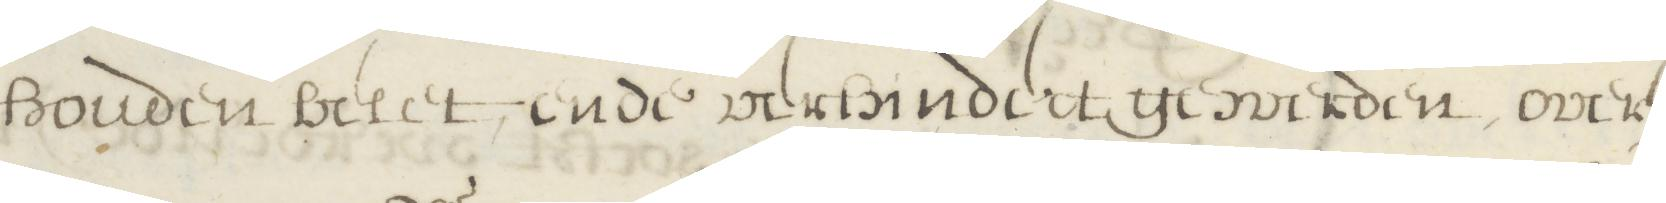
houden belet, ende verhindert gewerden, over
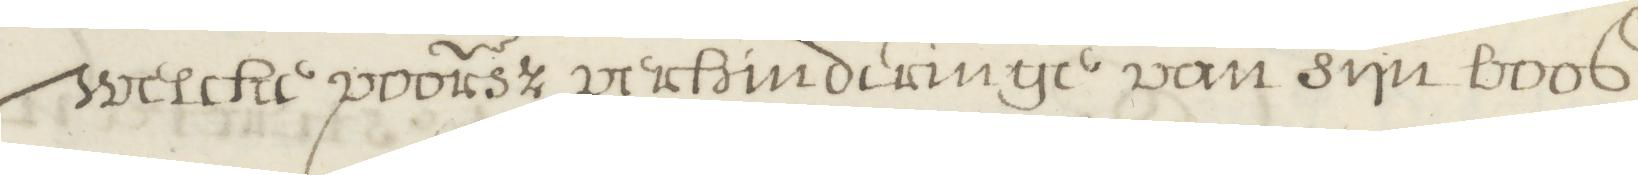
welcke voorsz verhinderinge van sijn boos
